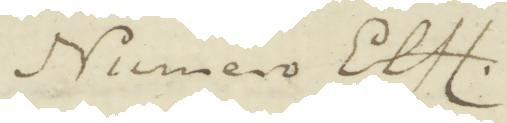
Numero Elff.
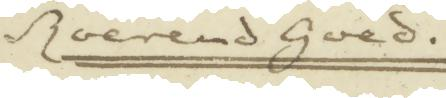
Roerend Goed.
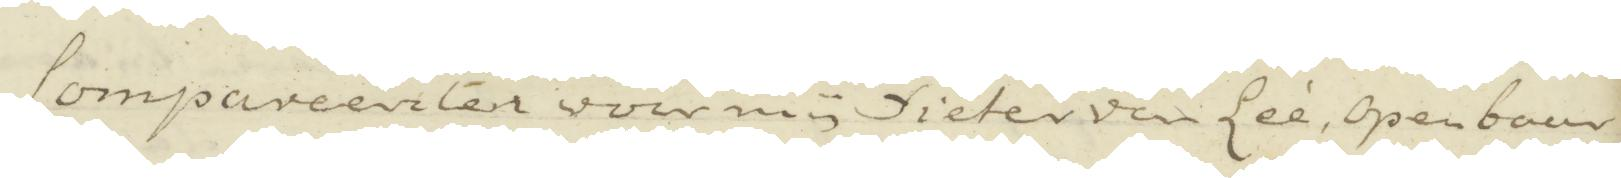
Compareerter voor mij Pieter van Leé, openbaar
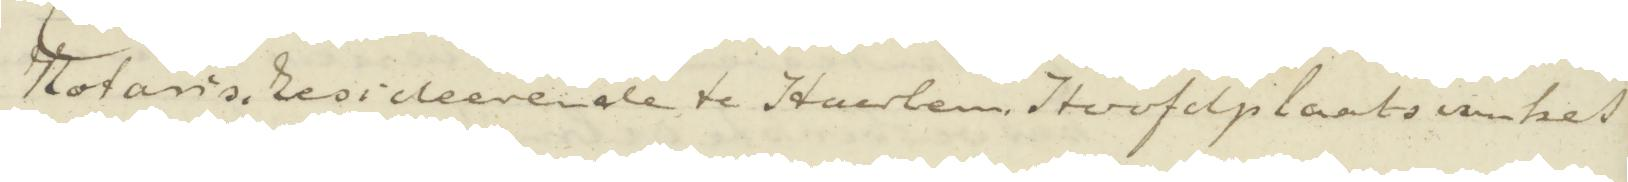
Notaris, resideerende te Haarlem, Hoofdplaats in het
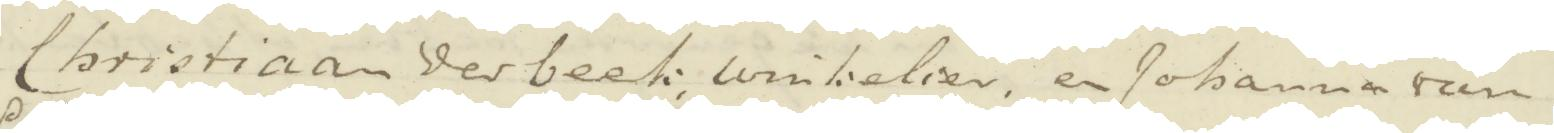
Christiaan Verbeek; winkelier, en Johanna van
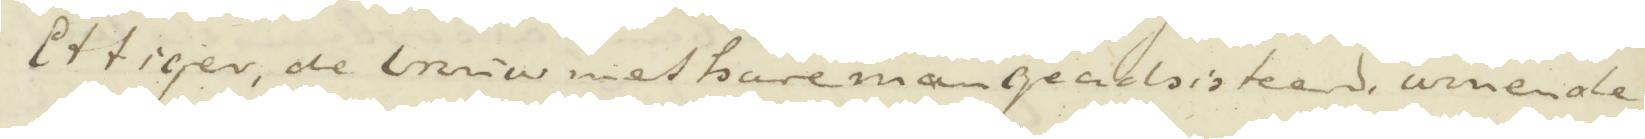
Ettiger, de vrouw met hare man geadsisteerd, wonende
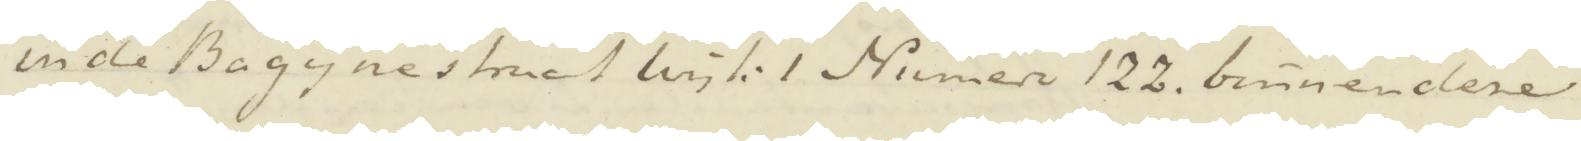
in de Bagijnestraat wijk 1 Numer 122. binnen deze
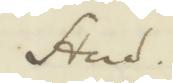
Stad.
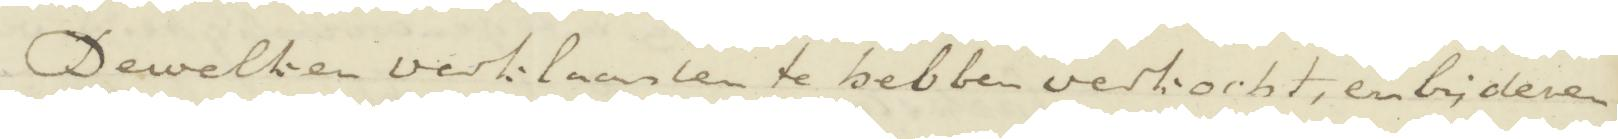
Dewelken verklaarden te hebben verkocht, en bij deze
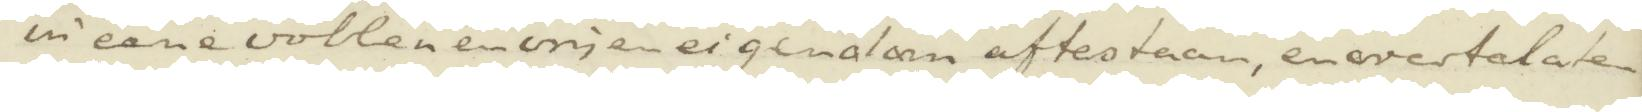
in eene vollen en vrijen eigendom aftestaan, en overtelaten
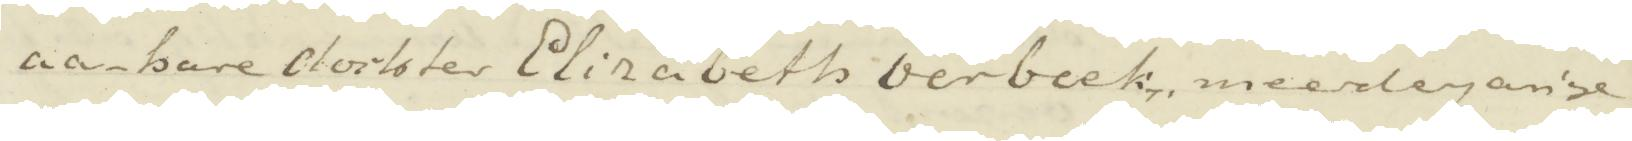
aan hare dochter Elisabeth Overbeek, meerderjarige
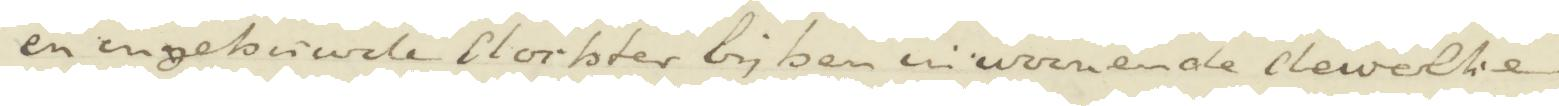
en ongehuwde dochter bij hen inwoonende dewelke
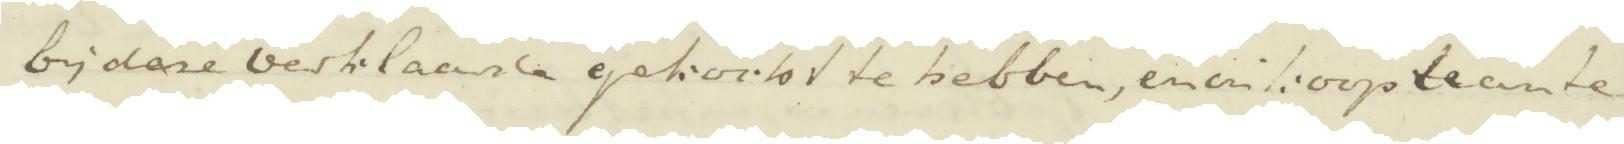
bij deze verklaarde gekocht te hebben, en inkoop te an te
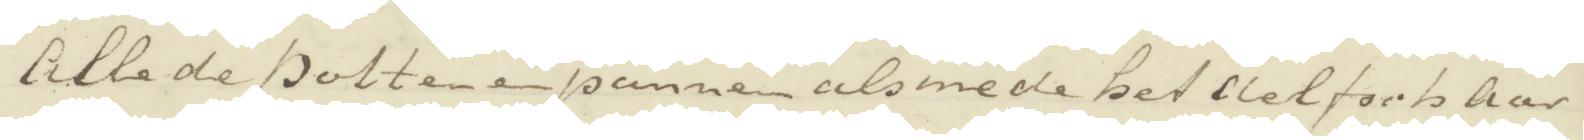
Alle de Potten en pannen alsmede het delfsch aar
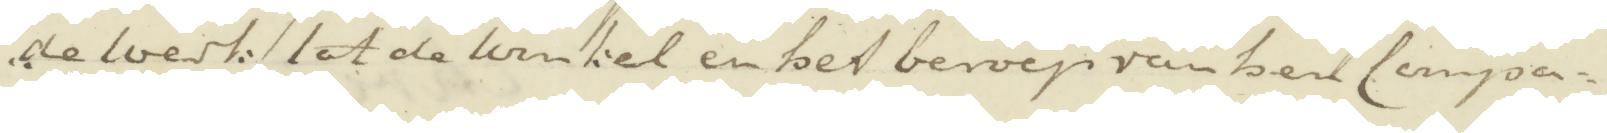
„de werk tot de winkel en het beroep van hen Compa
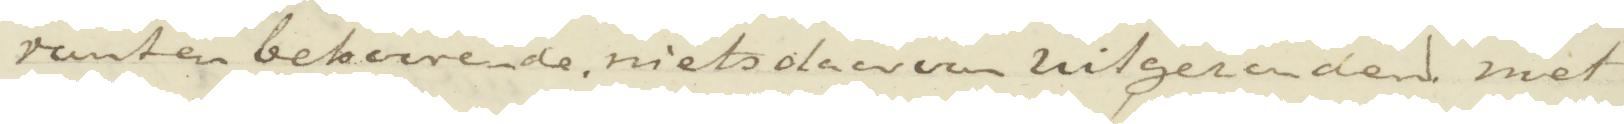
ranten behoorende, niets daarvan uitgezonden, met
